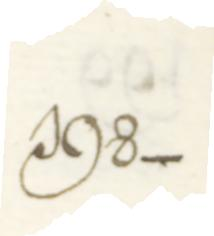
198_
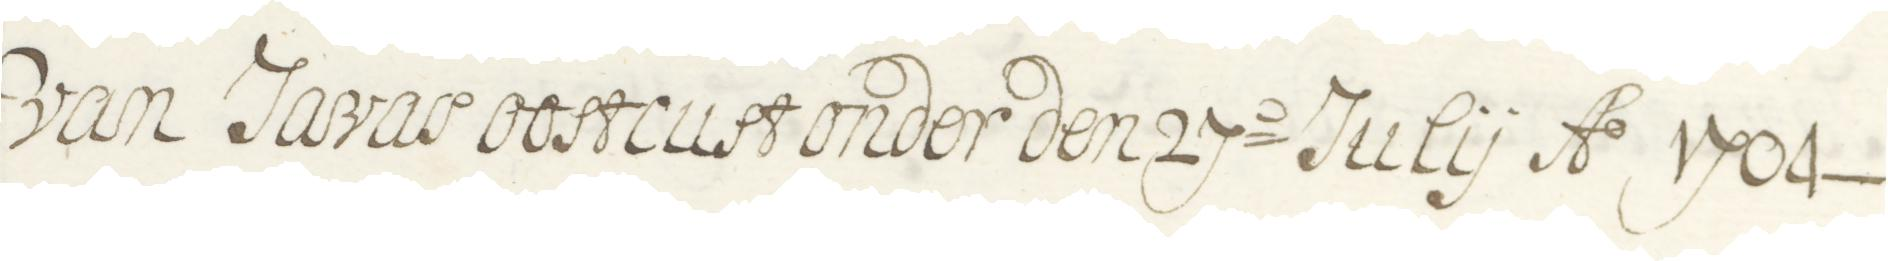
Van Javas oostcust onder den 27=' Julij Ao 1704_
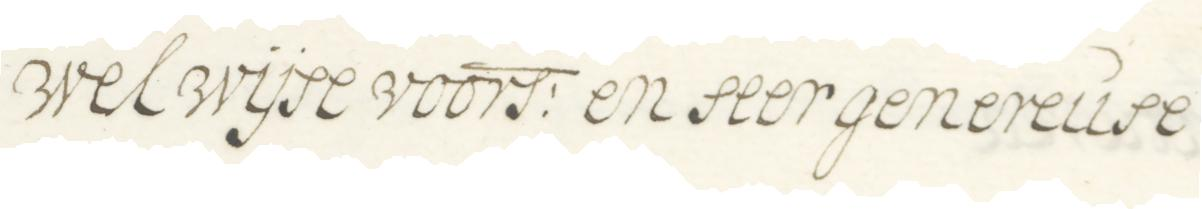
wel wijse voors: en seer genereuse
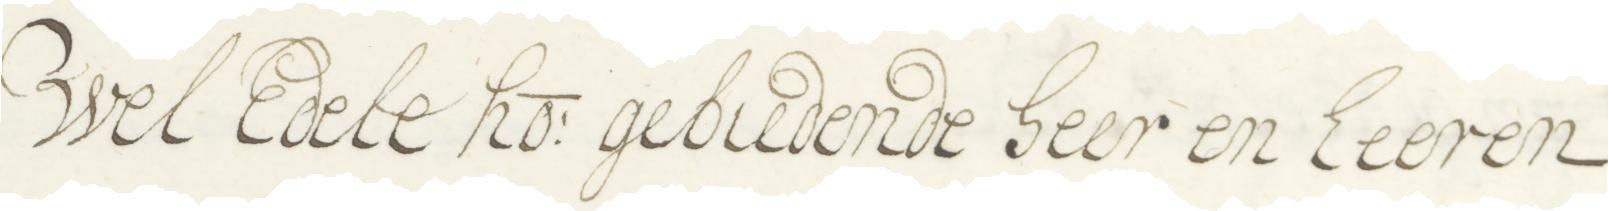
Wel Edele ho: gebiedende heer en heeren
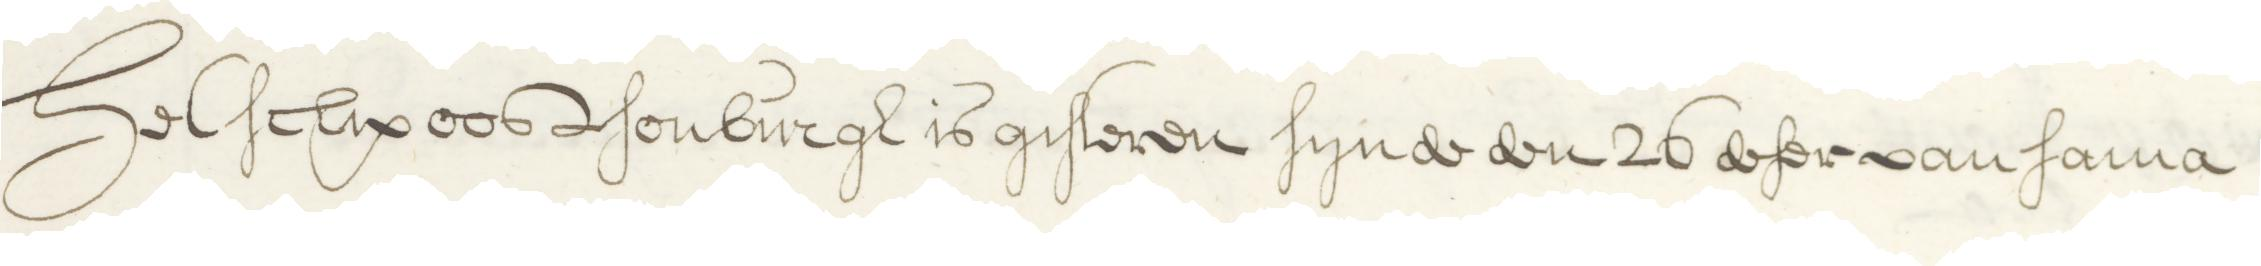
het schip oost-sonburgh is gisteren sijnde den 26 deser van sama
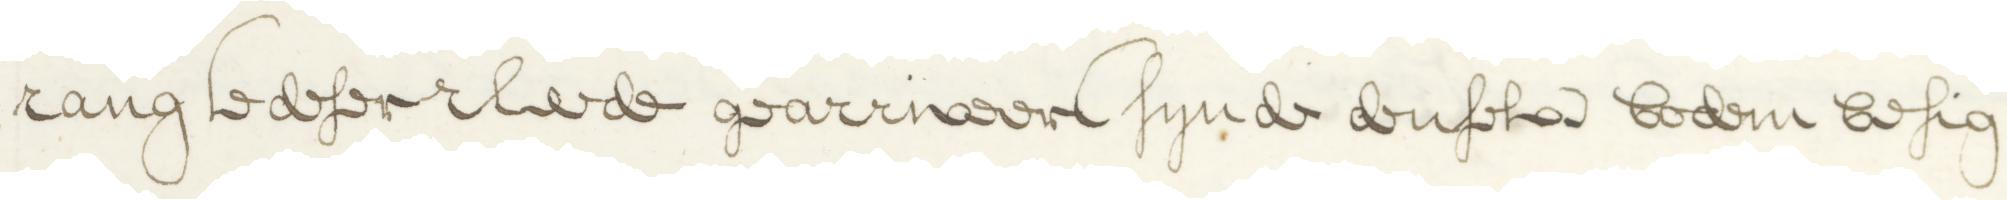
rang te deser rheede gearriveert sijnde denselve bodem besig
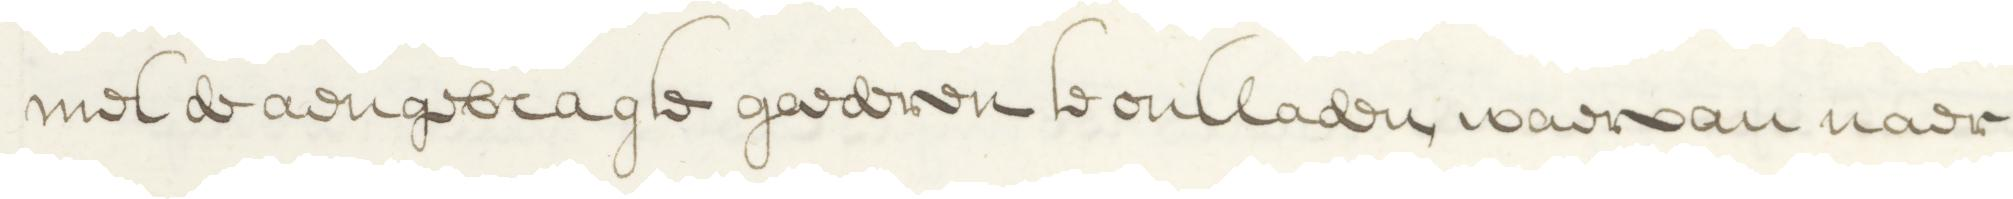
met de aengebragte goederen te ontladen, waervan naer
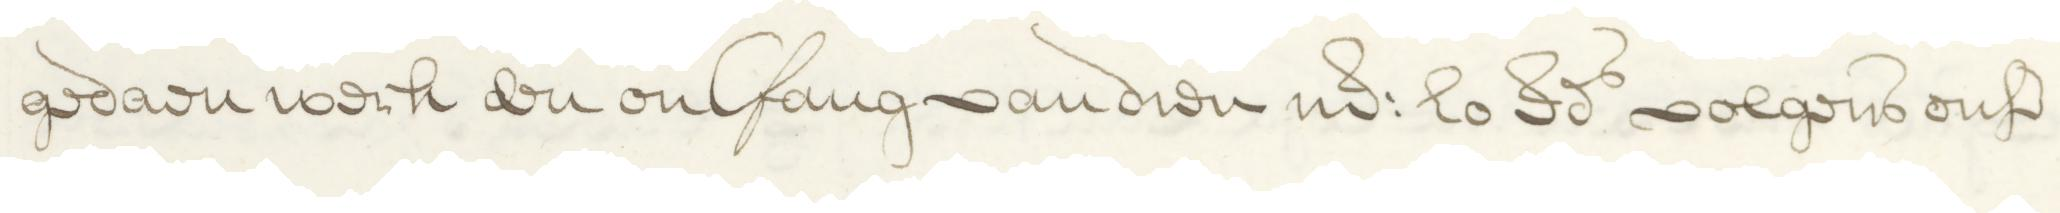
gedaen werk den ontfang van dien uE: ho Eds volgens onse
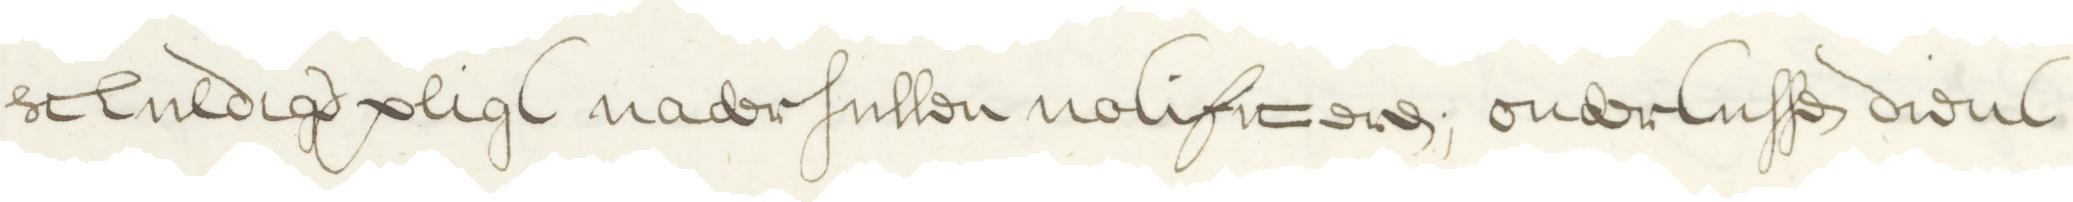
schuldige pligt nader sullen notificeren; ondertussen dient
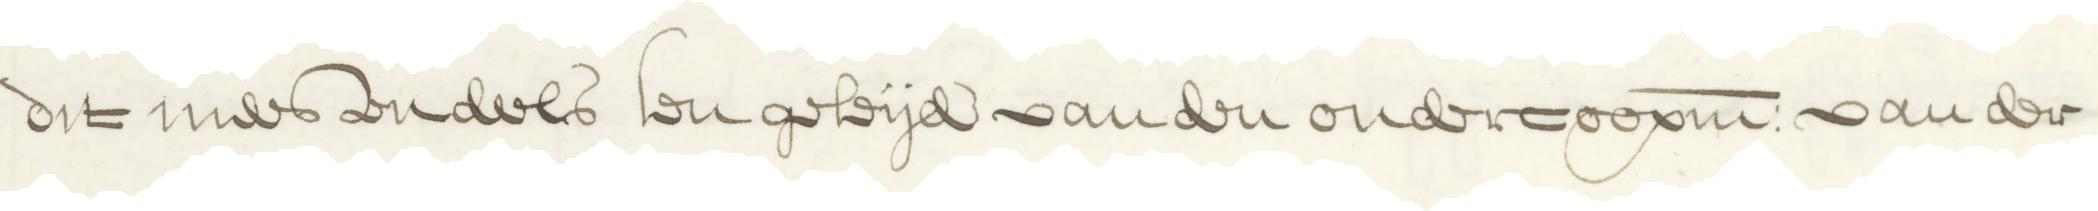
dit meestendeels ten geleijde van den ondercoopm: van der
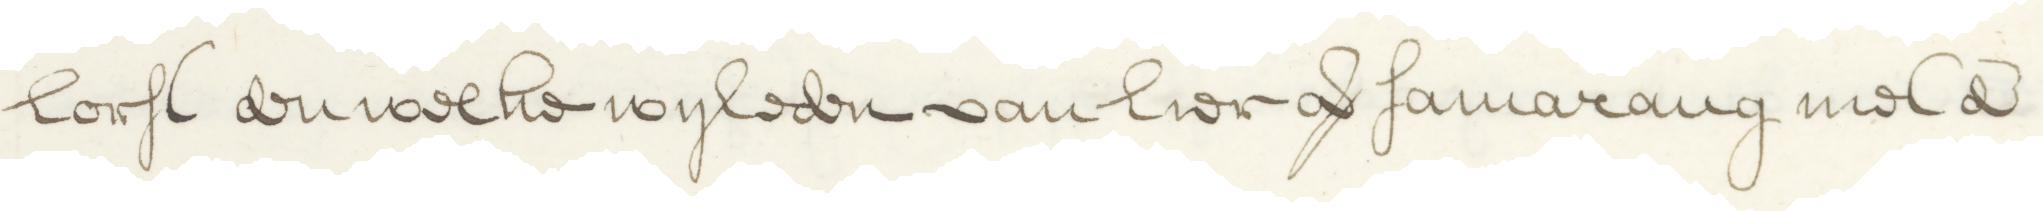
horst den welke wij heden van hier over samarang met de
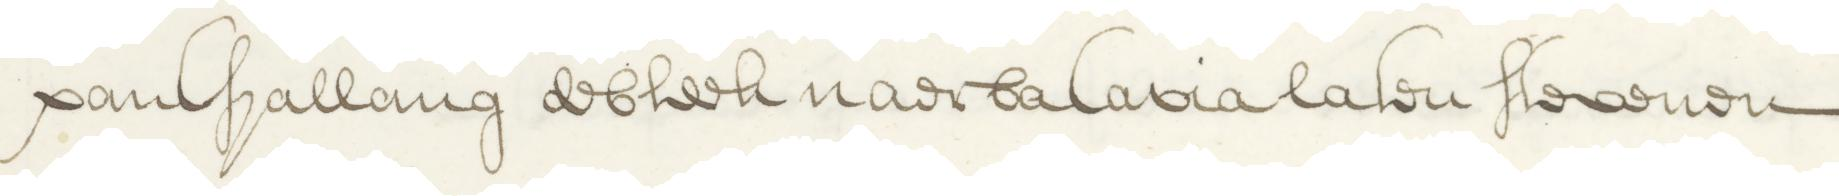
pantsjallang de bleek naer batavia laten stevenen
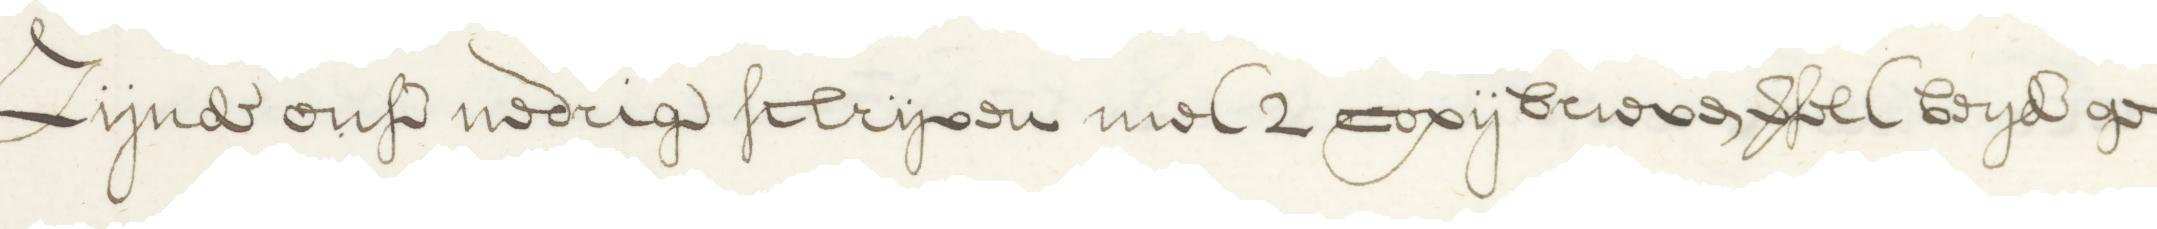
Zijnde onse nedrige schrijven met 2 copij brieven verselt beijde ge
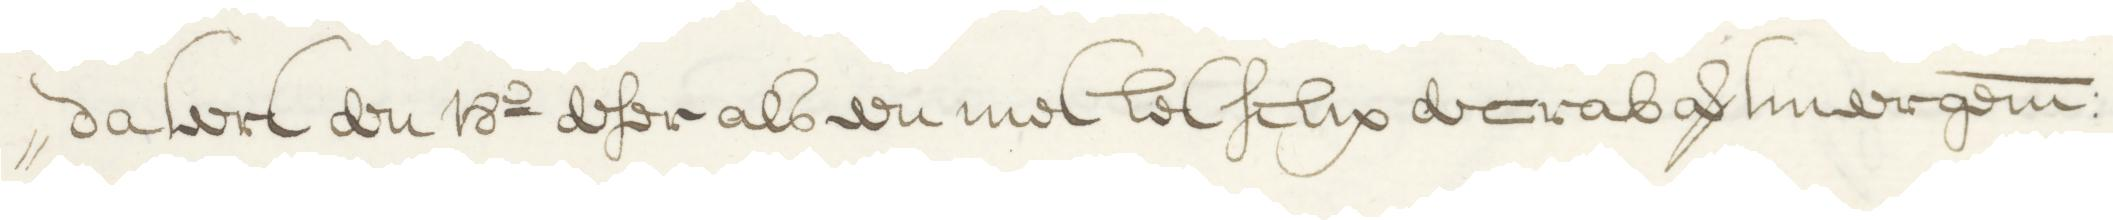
„dateert den 18=' deser als een met het schip de crab over tmeer gem:
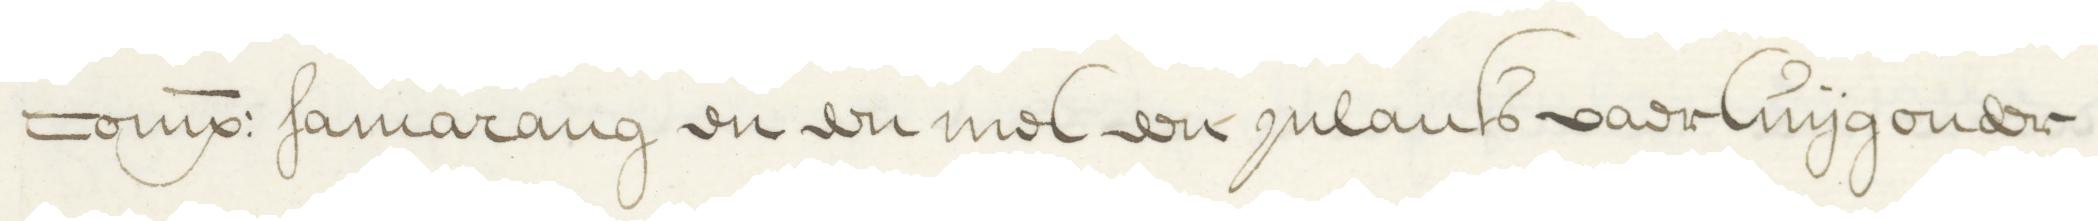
comp: samarang en een met een jnlants vaertuijg onder
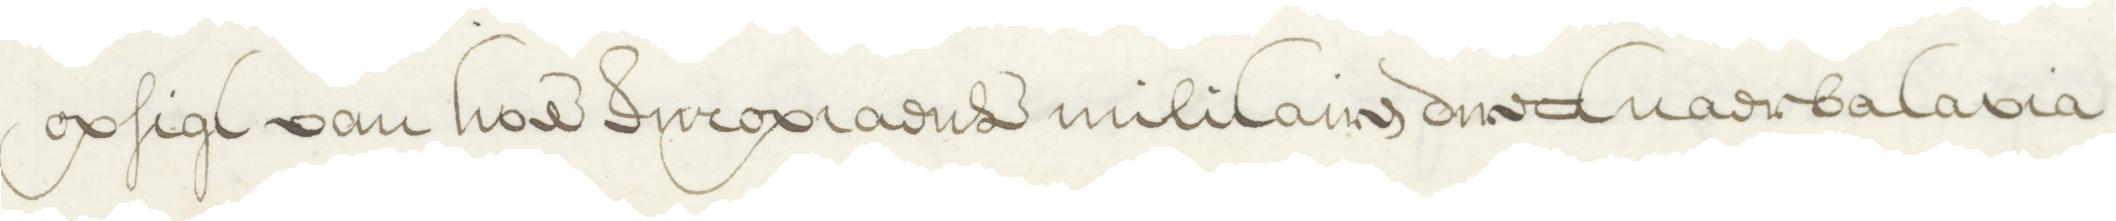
opsigt van twee Europeaense militairen direct naer batavia
